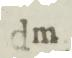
dm
